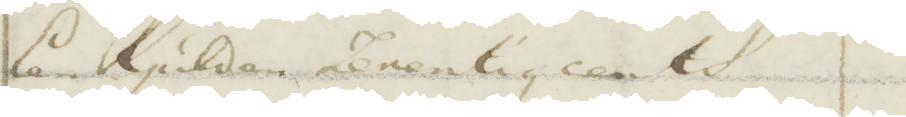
Een Gulden Zeventig cents
